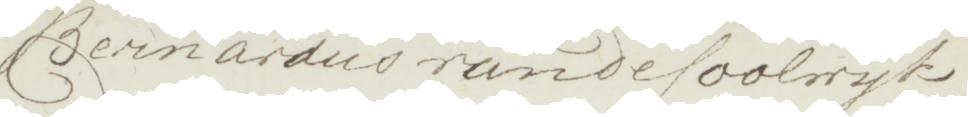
Bernardus van de Coolwyk
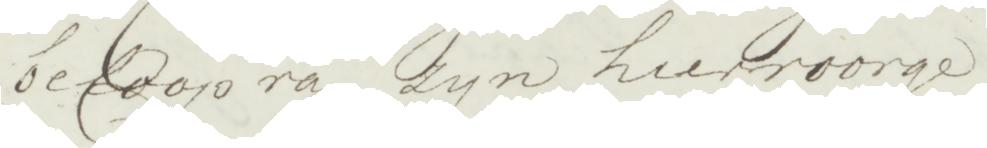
beloop van zyn hier voorge
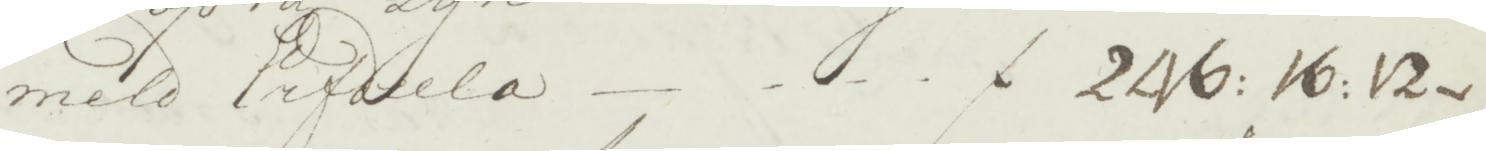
meld Erfdeel a - - - - - ƒ 246: 16: 12 -
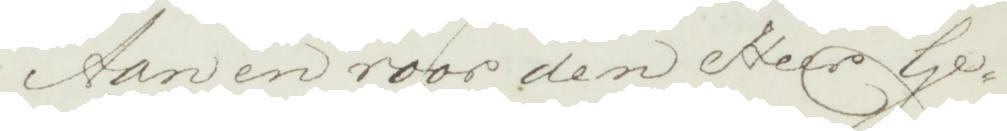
Aan en voor den Heer Ge„
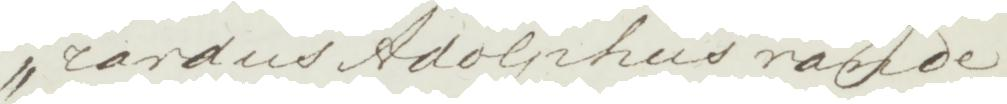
„rardus Adolphus van de
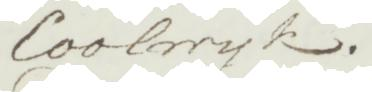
Coolwyk.
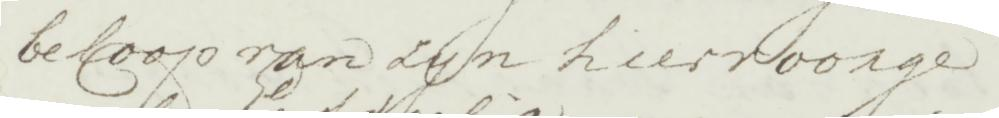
beloop van zyn hiervoor ge
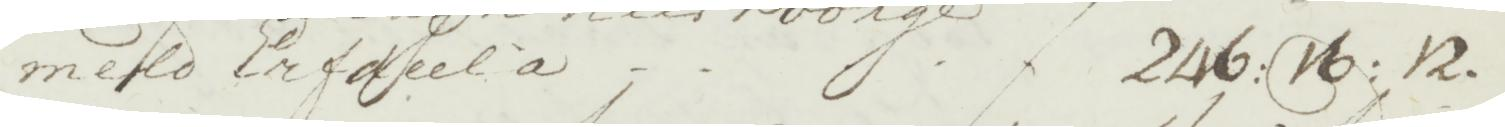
meld Erfdeel à - - - - - ƒ 246: 16:12.
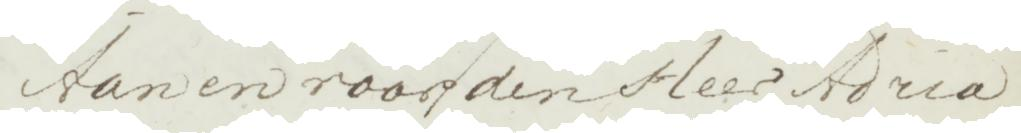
Aan en voor den Heer Adria
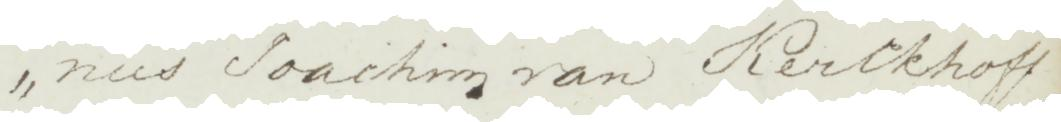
„nus Joachim van Kerckhoff
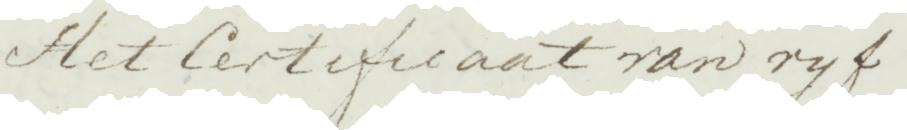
Het Certificaat van vyf
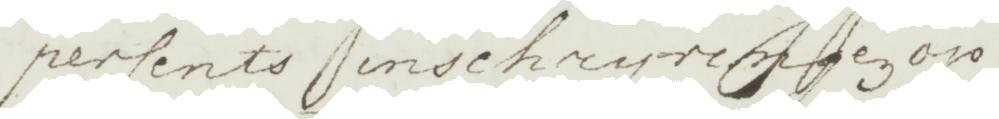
percents inschryvingen op
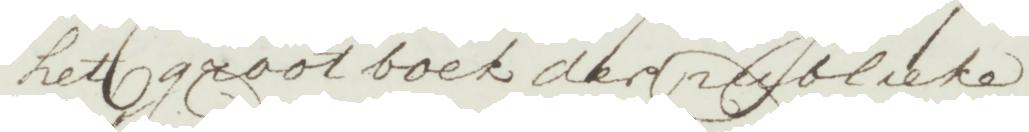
het grootboek der publieke
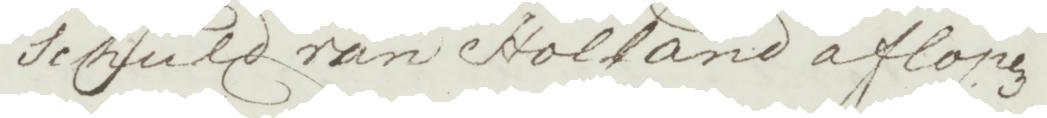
Schuld van Holland aflopen
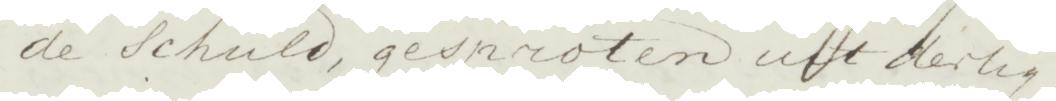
de schuld, gesproten uit dertig
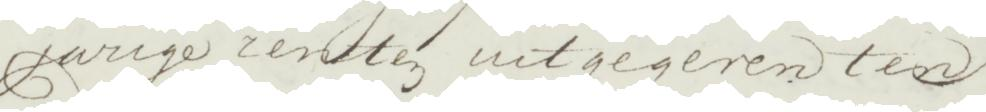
jarige renten uitgegeven ten
